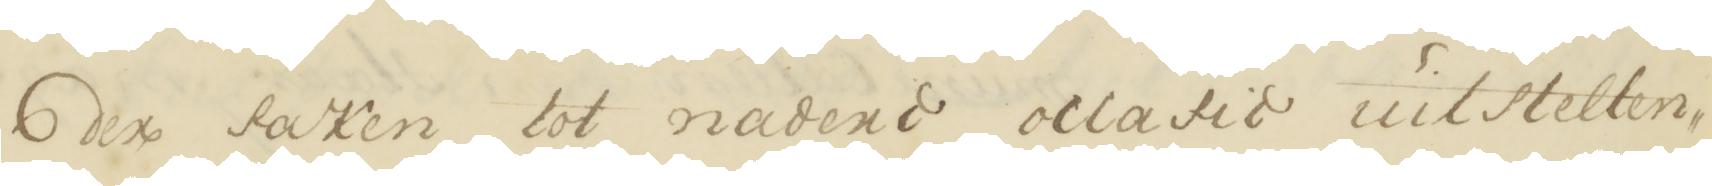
der saken tot nadere occasie uitstellen„
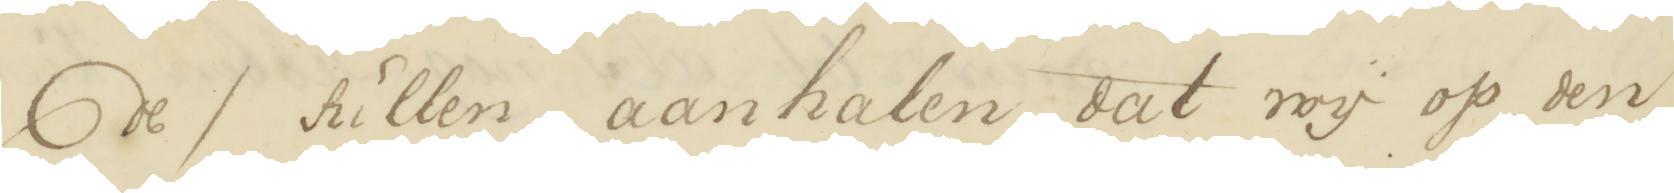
de / sullen aanhalen dat wij op den
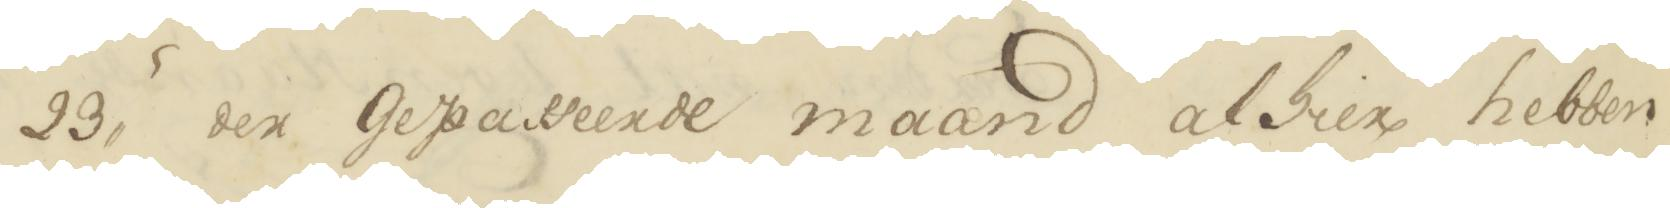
23„' der gepasseerde maand alhier hebben
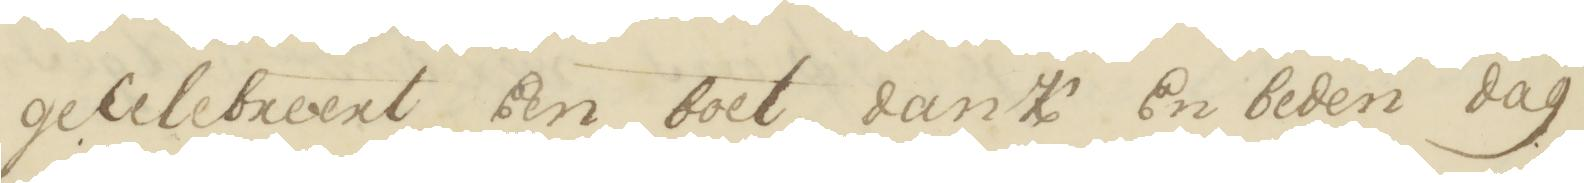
gecelebreert een boet dank en beden dag
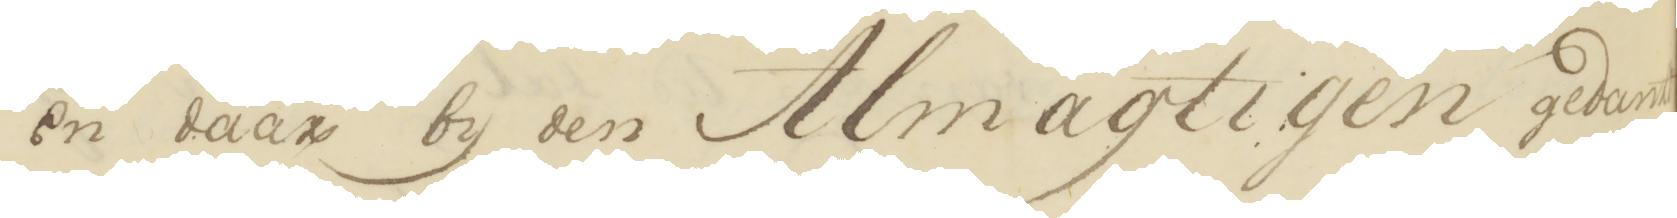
en daar by den Almagtigen gedankt
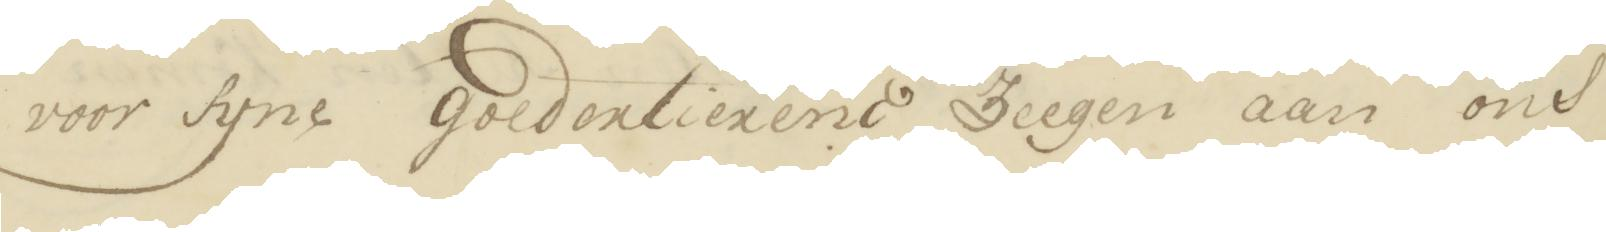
voor syne goedertierene Zeegen aan ons
